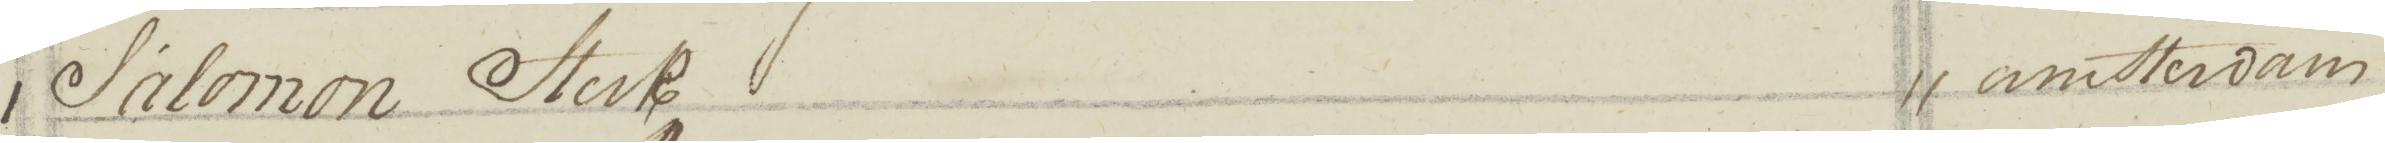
1 Salomon Sterk „ amsterdam
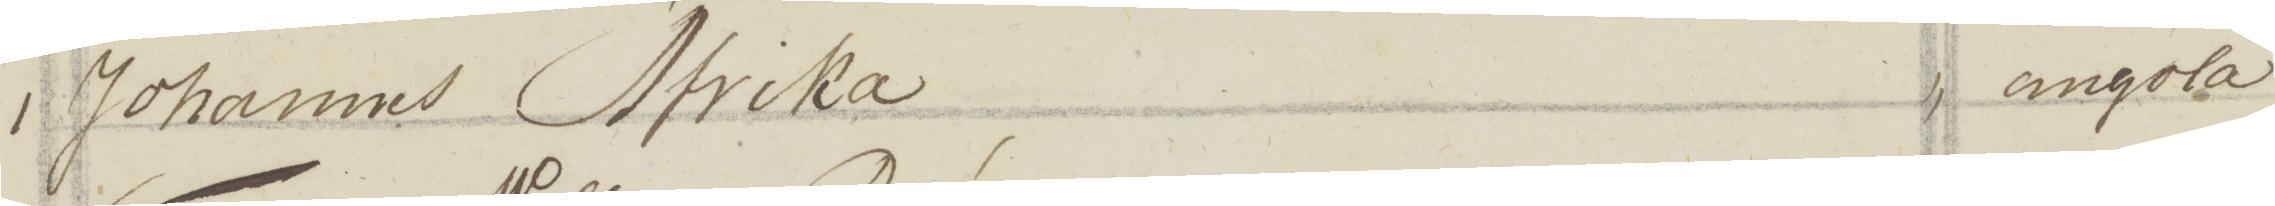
1 Johannes Afrika „ angola
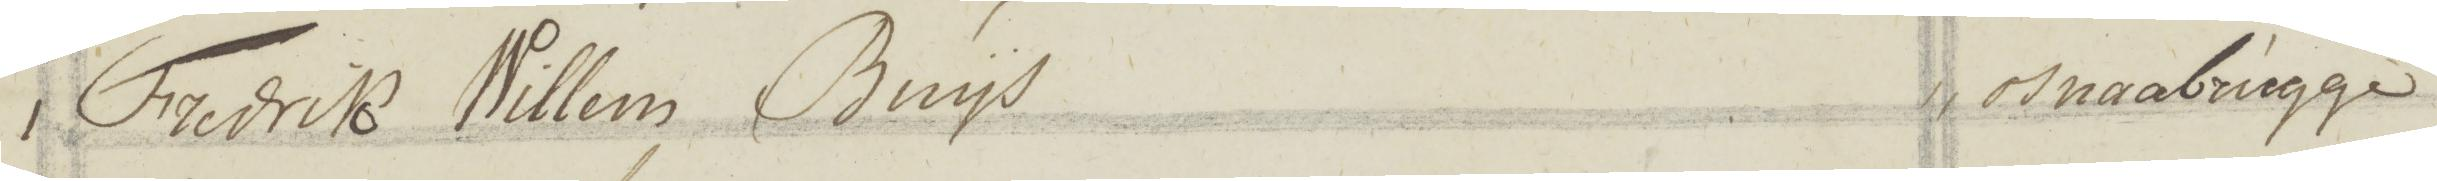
1 Fredrik Willem Buijs „ osnaabrugge
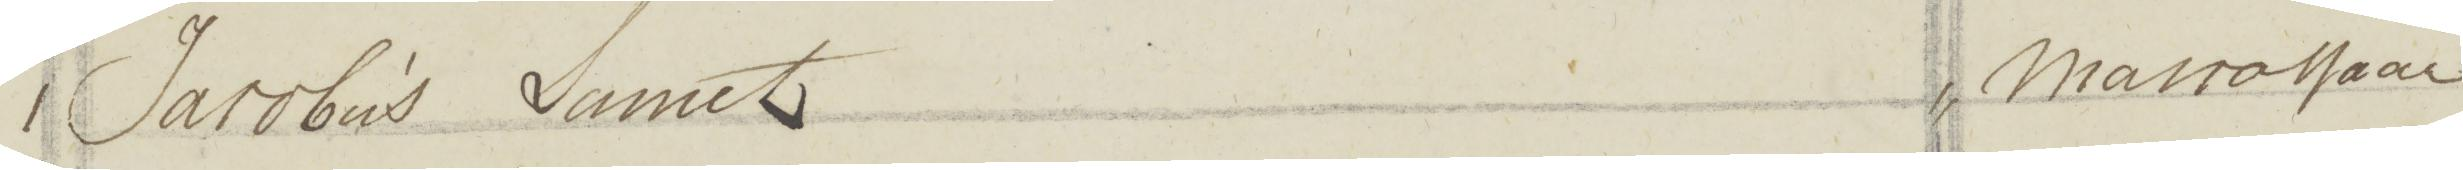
1 Jacobus Samet „ Maccosaar
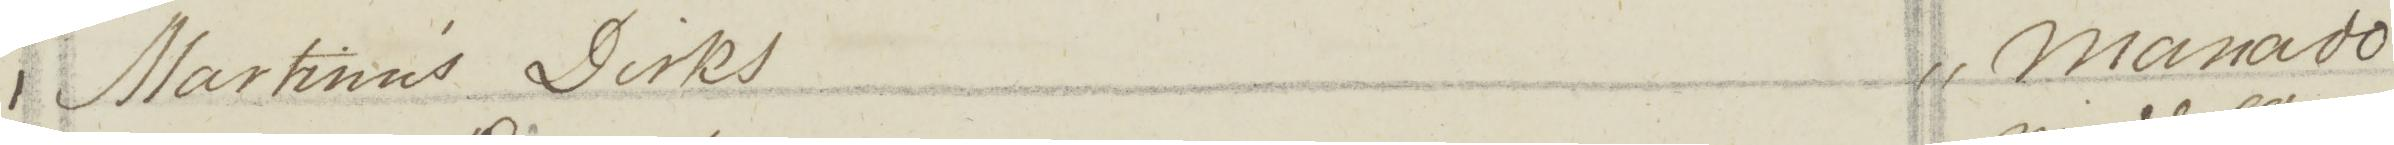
1 Martinus Dirks „ Manado
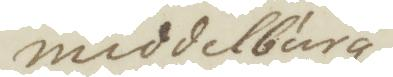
middelburg
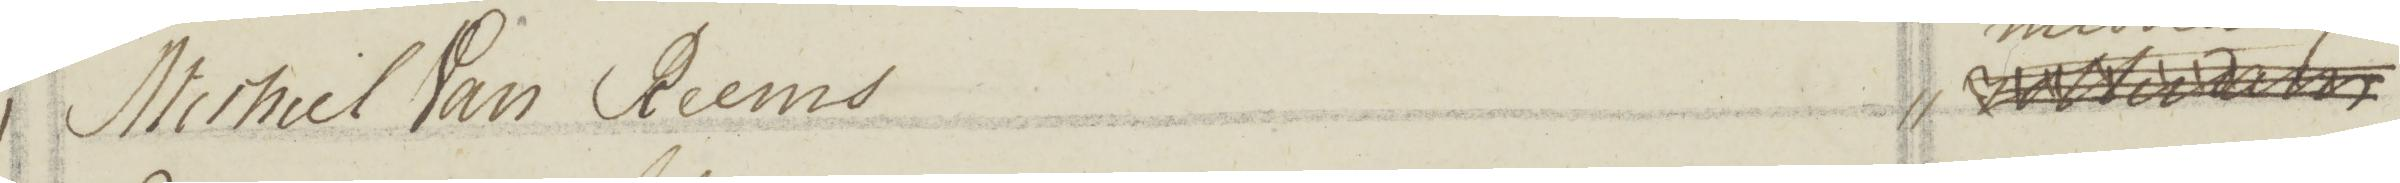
1 Michiel Van Reems „ rotterdam
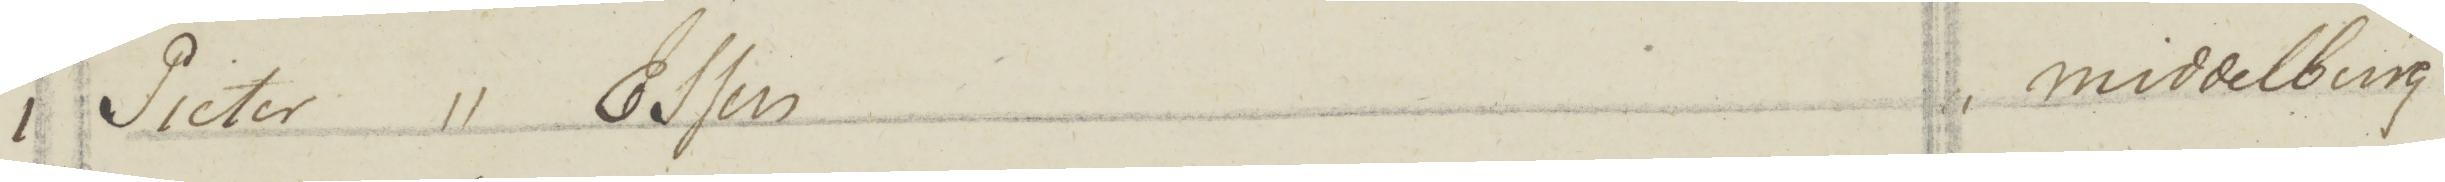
1 Pieter „ Essen „ middelburg
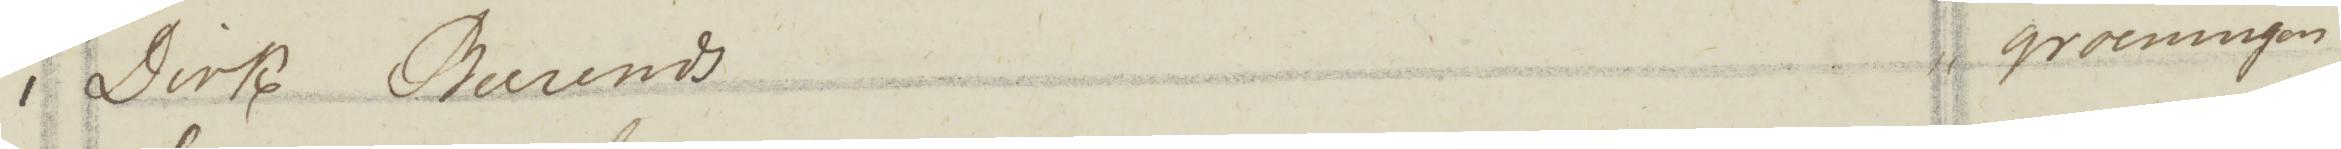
1 Dirk Beerends „ groeningen
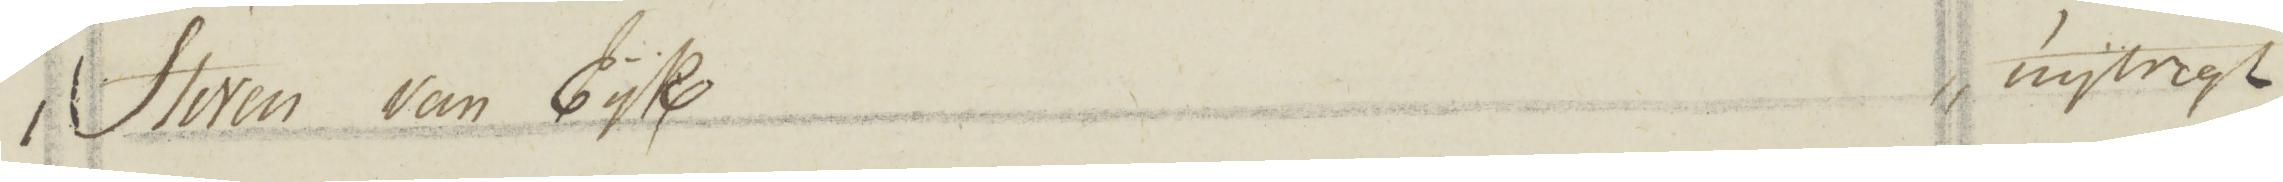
1 Steven van Eijk „ uijtregt
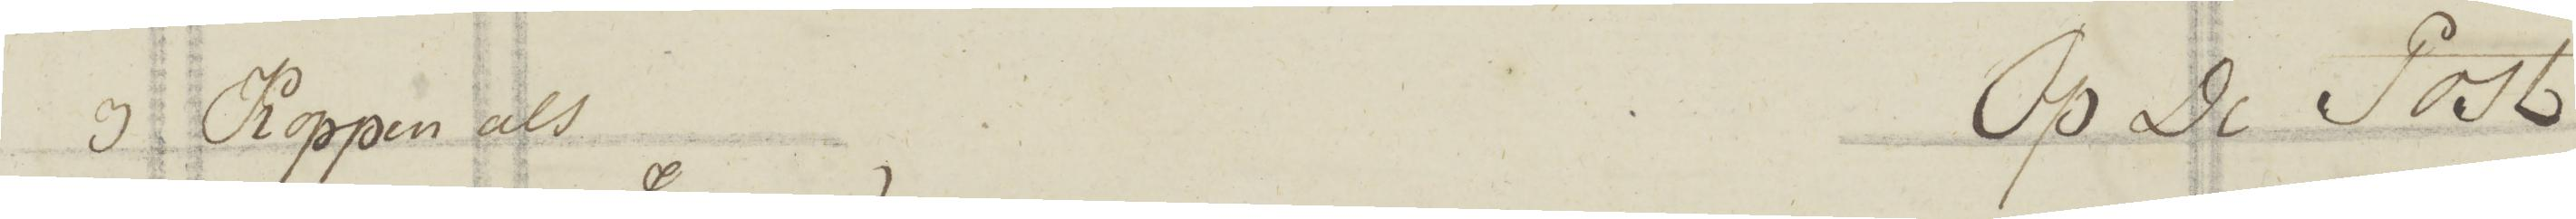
3 Koppen als Op De Post
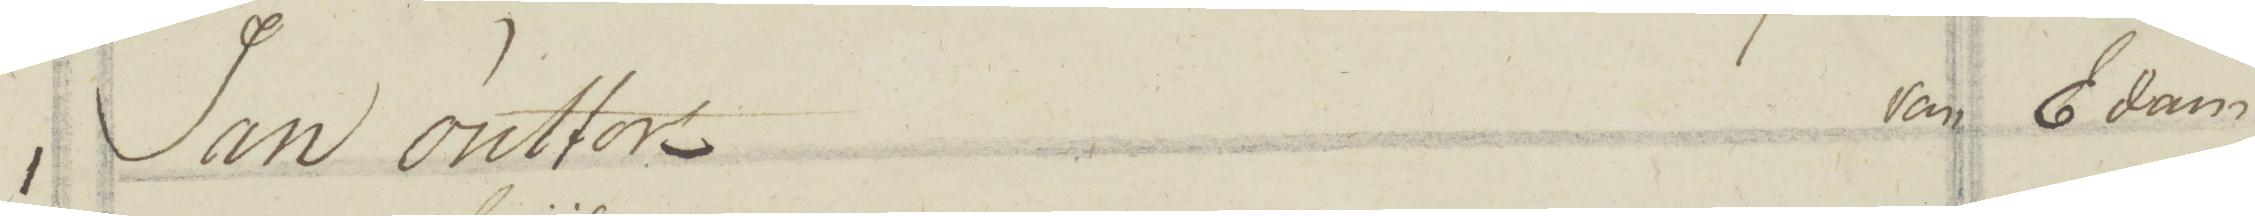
1 Ian outfort Van Edam
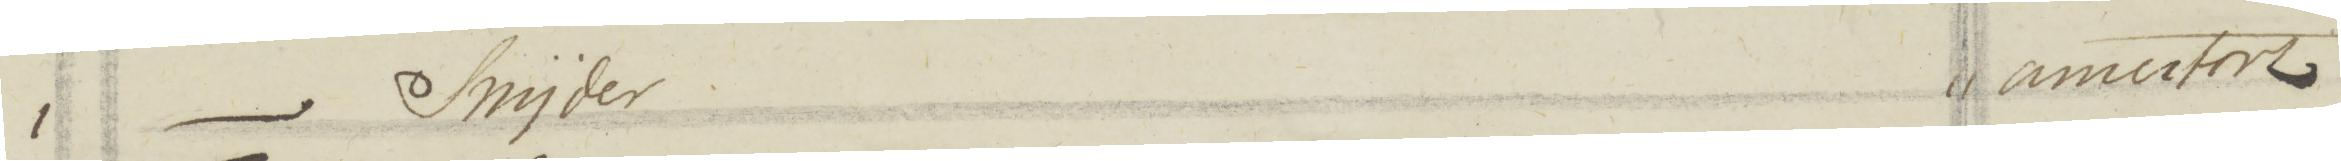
1 —' Snijder „ amerfort
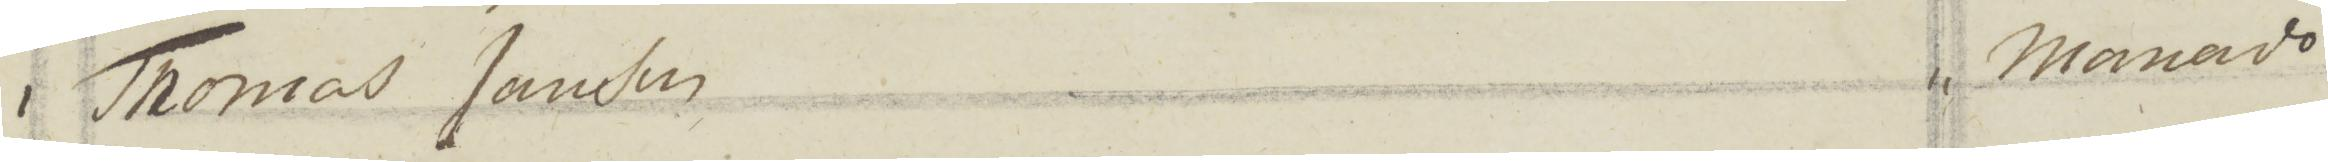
1 Thomas Jansen „ Manado
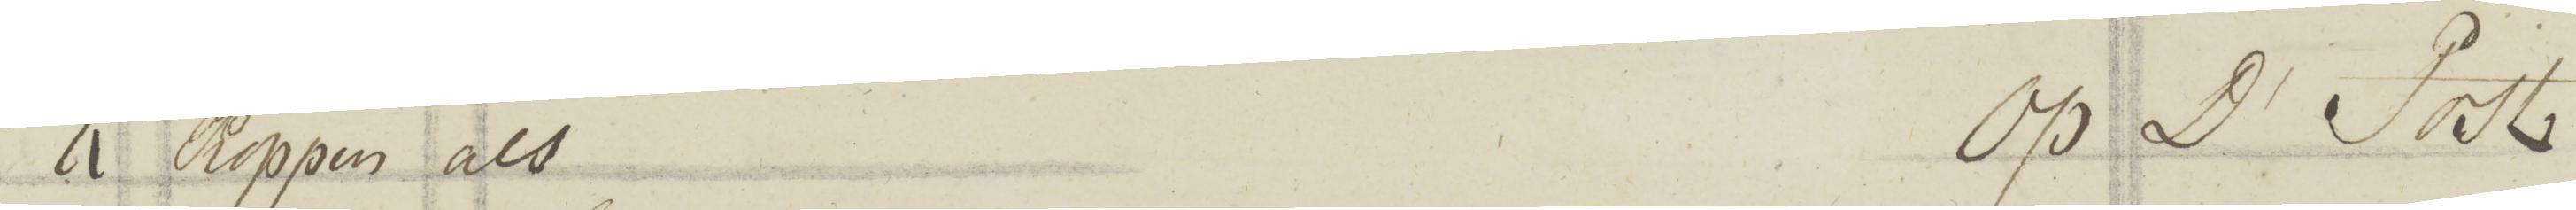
4 Koppen als Op D' Post
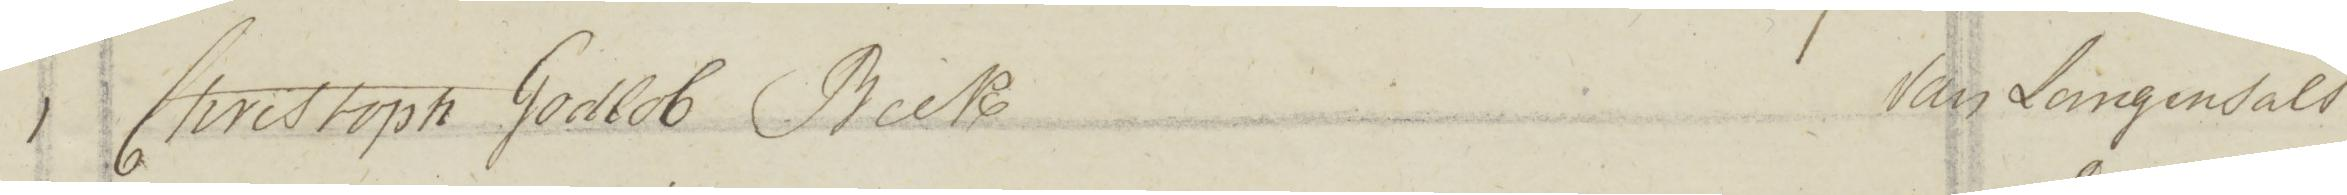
1 Christoph Godlob Beek Van Langensalt
